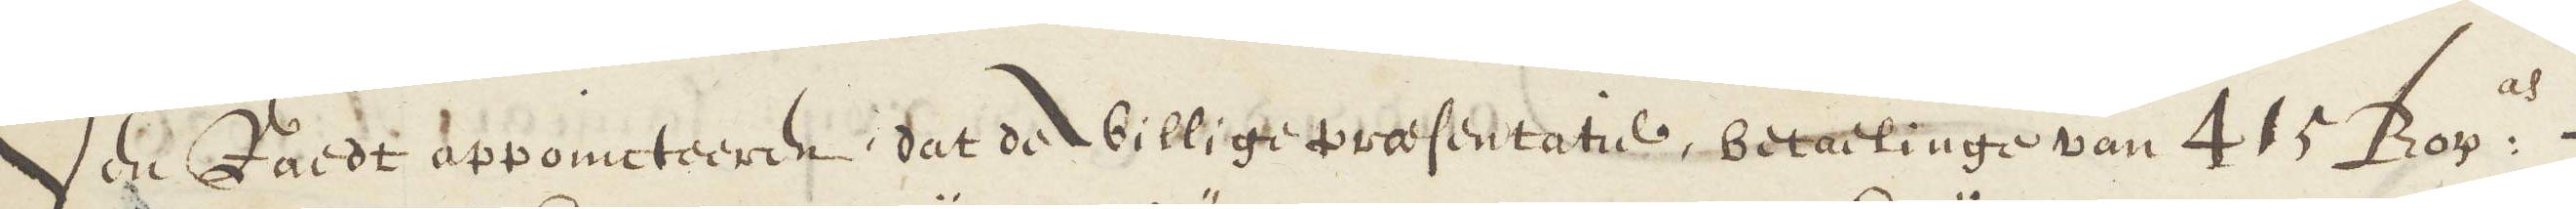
Den Raedt appoincteeren, dat de billige praesentatie, betaelinge van 415 Rop:as
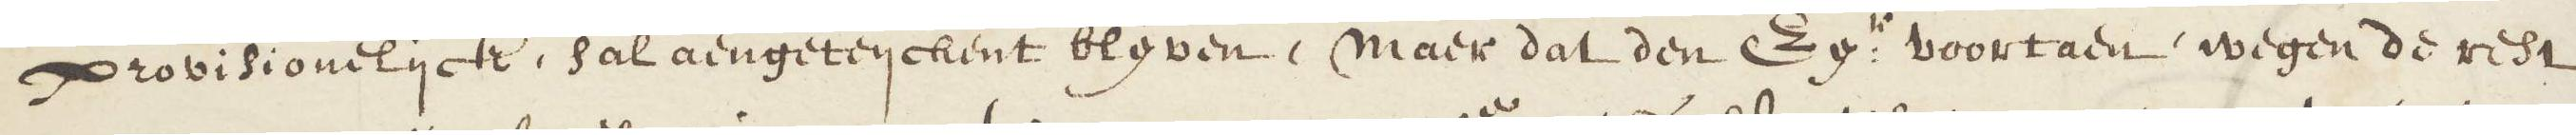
provisionelijck, sal aengeteijckent blijven, maer dat den Ey:r voortaen, wegen de rest
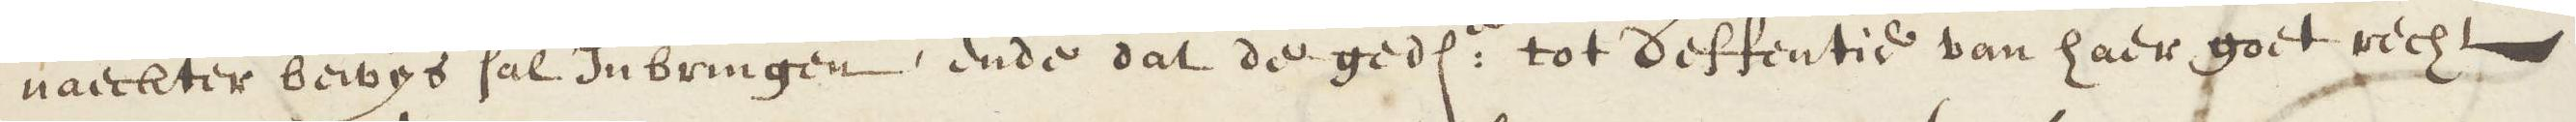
na echter bewijs sal Inbringen, ende dat de gedh:e tot deffentie van haer goet recht
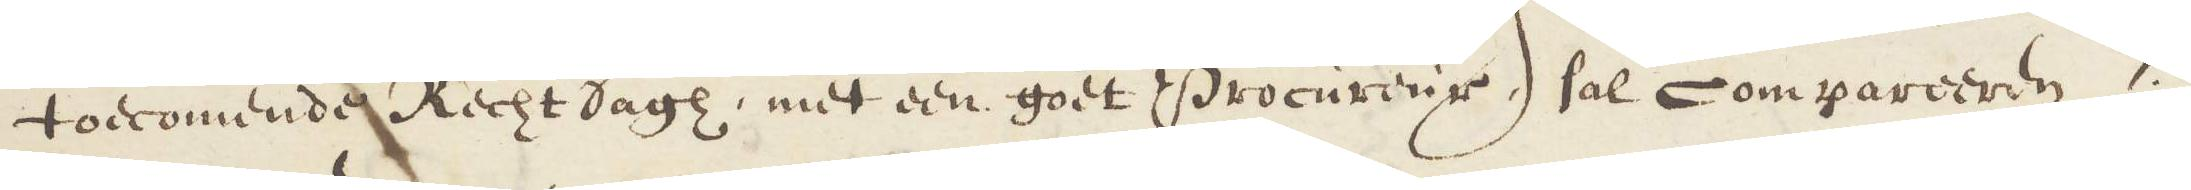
toecomende Rechtdagh, met een goet Procureur, sal compareeren /.
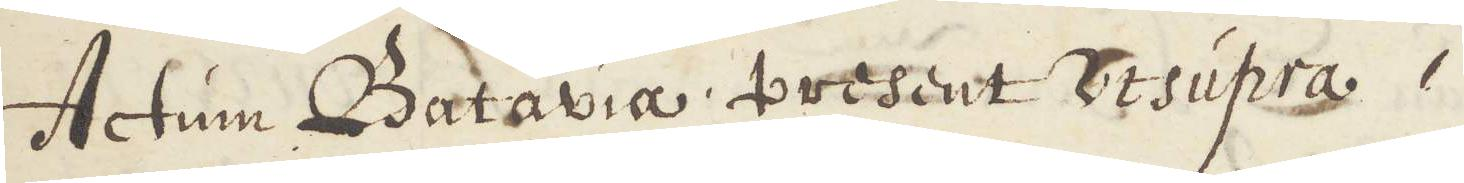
Actum Batavia, present vt supra /
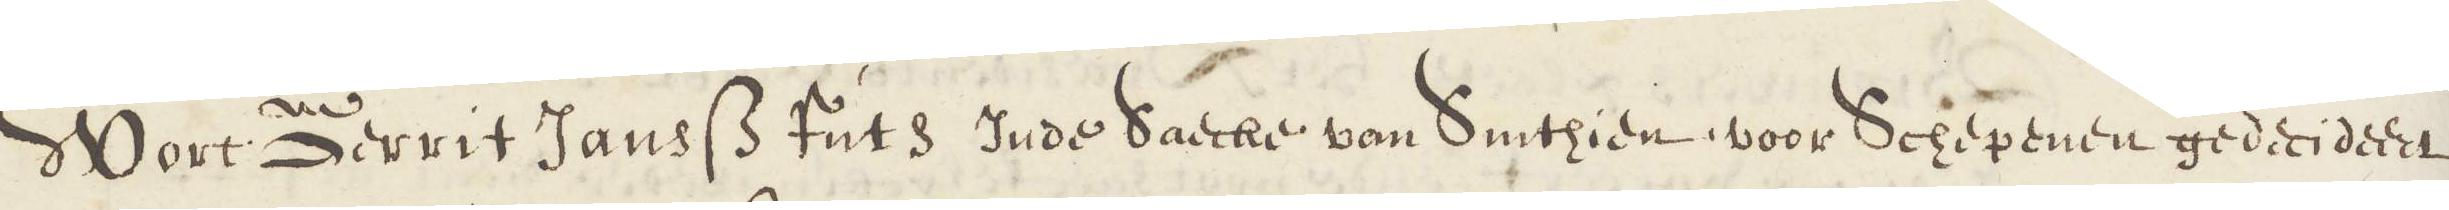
Wort Gerrit Janssz Ruts Inde saecke van Sinthien, voor schepenen gedecideert
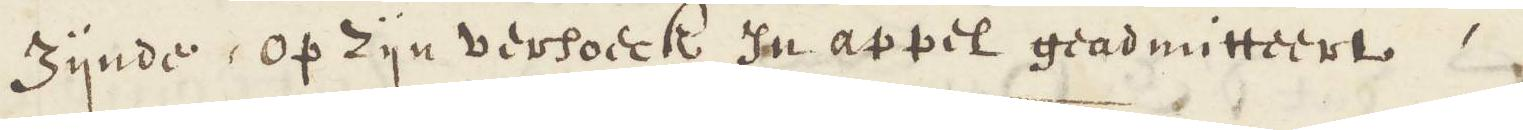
zijnde, op zijn versoeck In appel geadmitteert /
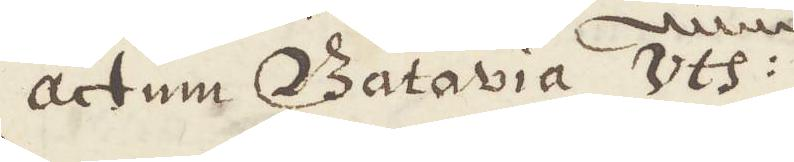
actum Batavia vts:
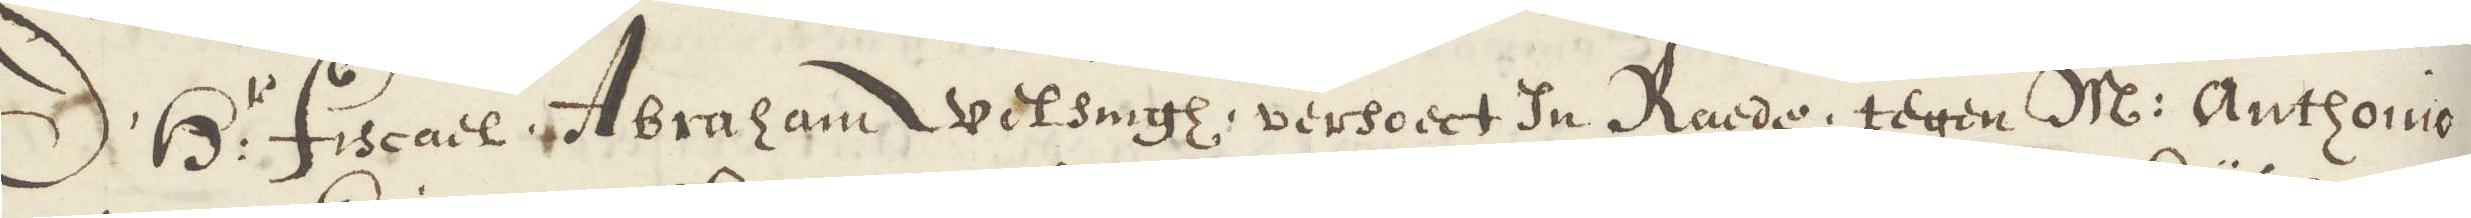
d’ h:r fiscael . Abraham Welsingh: versoect In Raede, tegen M:r Anthonio
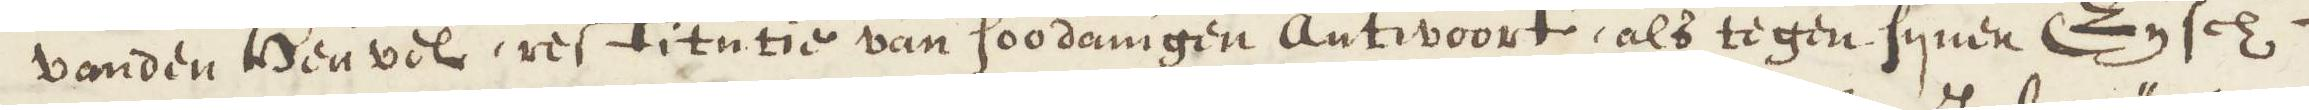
van den Heuvel restitutie van soodanigen antwoort, als tegen sijner Eijsch
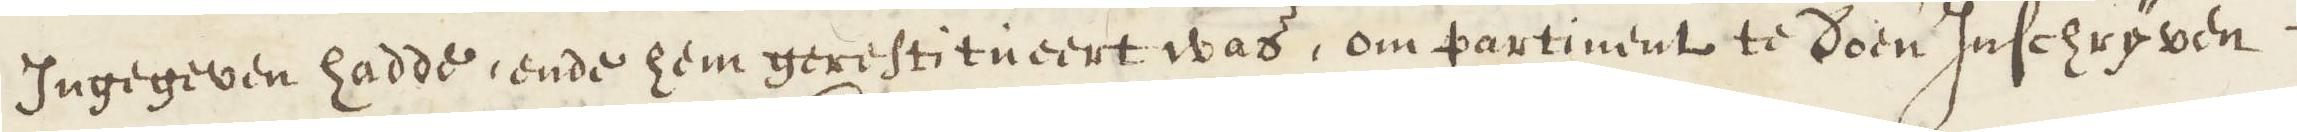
Ingegeven hadde, ende hem gerestitueert was, om partinent te doen Jnschrijven
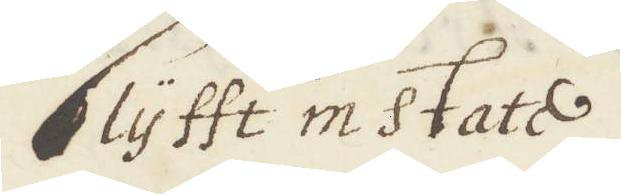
blijfft in state
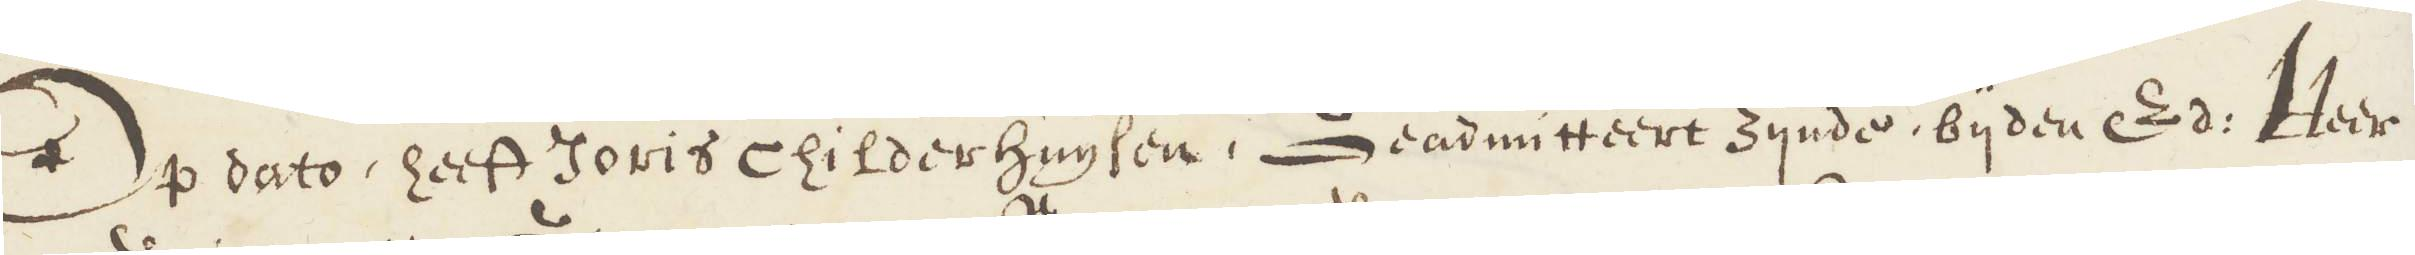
Op dato, heeft Ioris childerhuijsen, Geadmitteert zijnde, bij den Ed: Heer
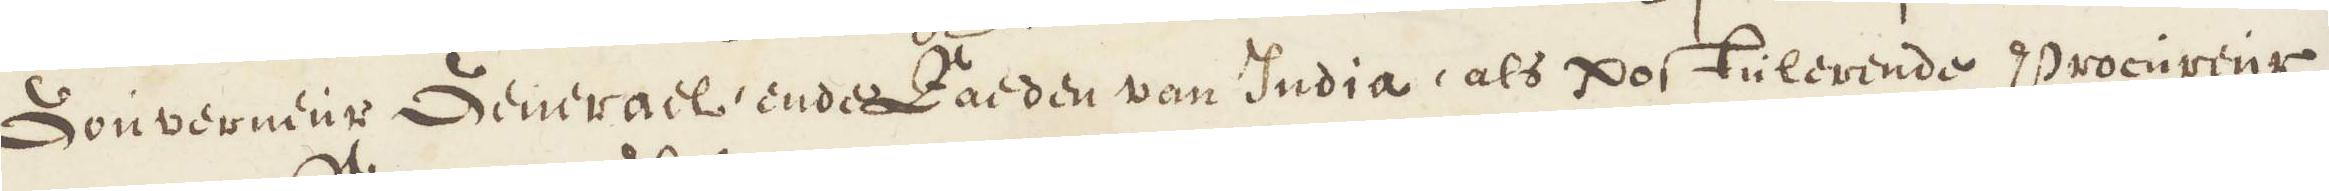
Gouverneur Generael ende Raeden van India, als postulerende Procureur
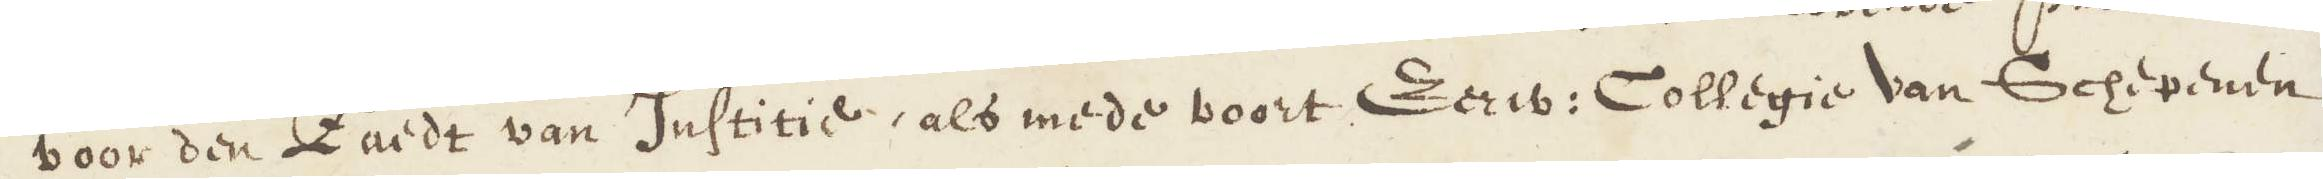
voor den Raedt van Iustitie, als mede voort Gerw: Collegie van Schepenen
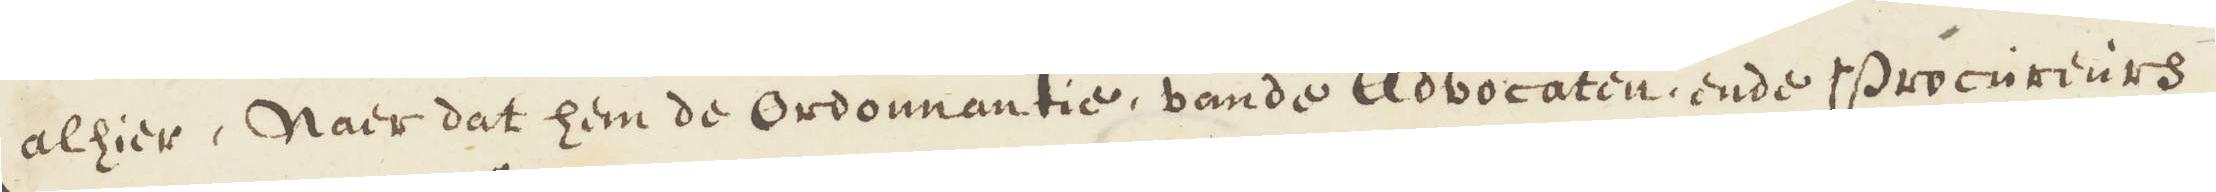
alhier, naer dat hem de ordonnantie, van de Advocaten ende Procureurs
